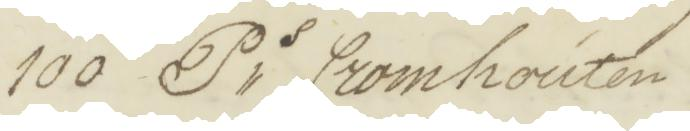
100 P„s Cromhouten
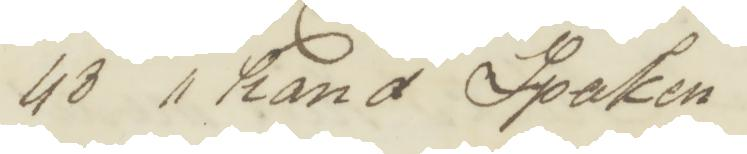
48 „ hand spaken
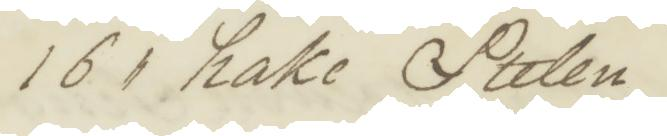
16 „ hake Stelen
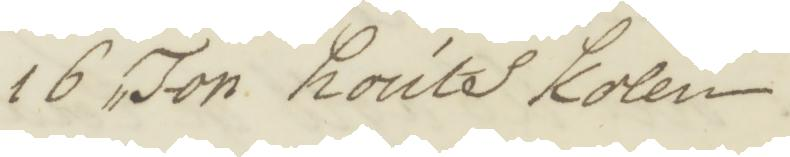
16 „Ton houts kolen
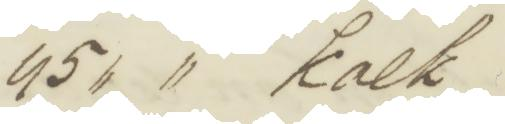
45„ „ kalk
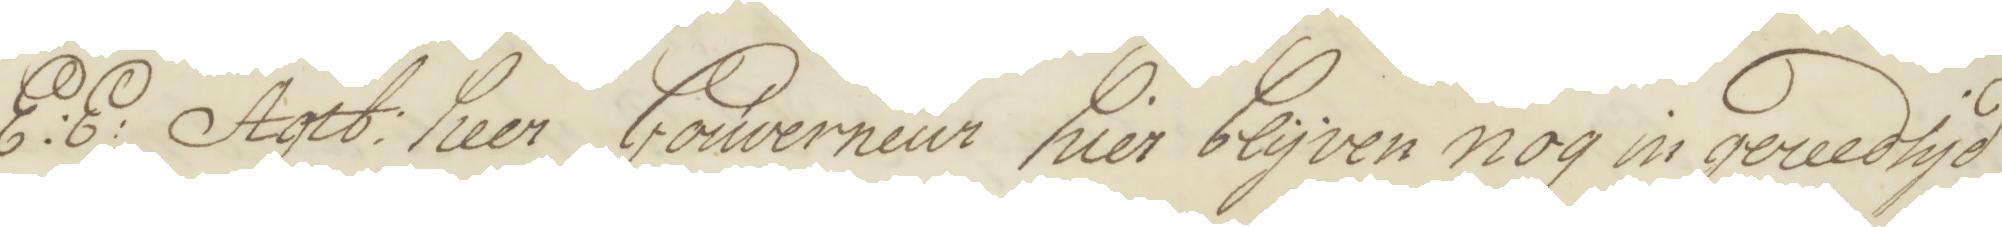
E: E: Agtb: heer Gouverneur hier blijven nog in gereedhijd
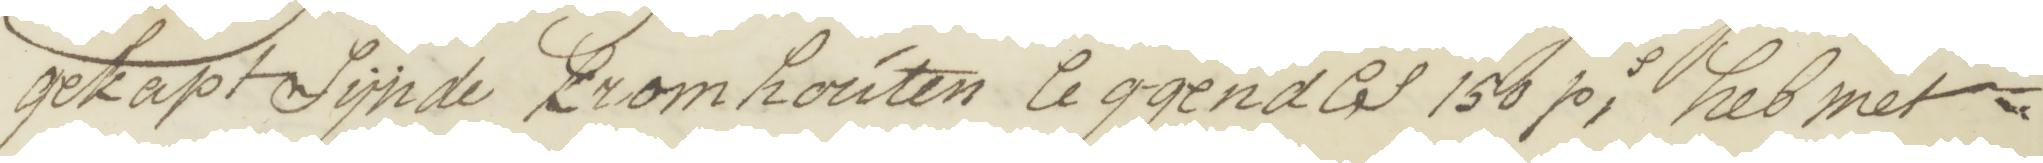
gekapt sijnde kromhouten leggendes 150 p„s heb met
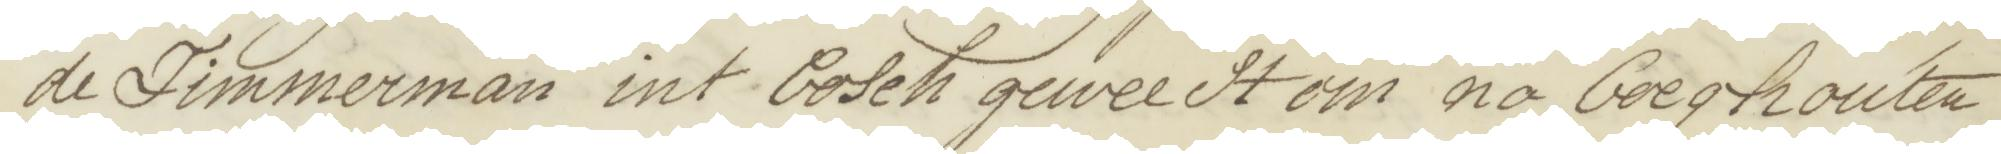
de Timmerman int bosch geweest om na boeghouten
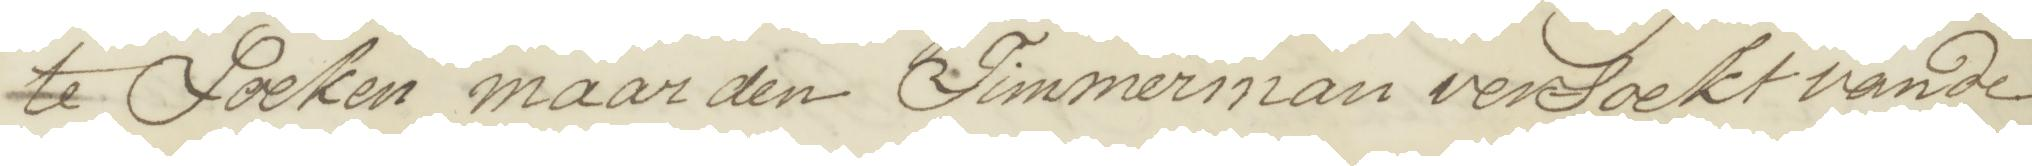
te soeken maar den Timmerman versoekt van de
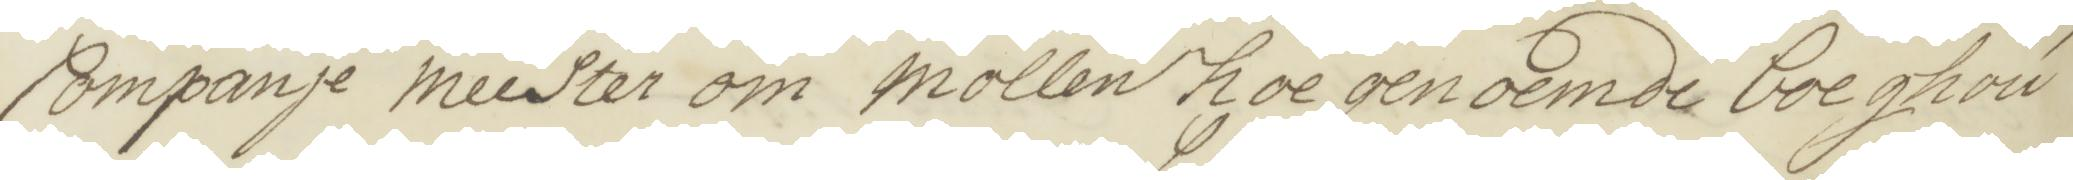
companje meester om mollen hoe genoemde boeghou
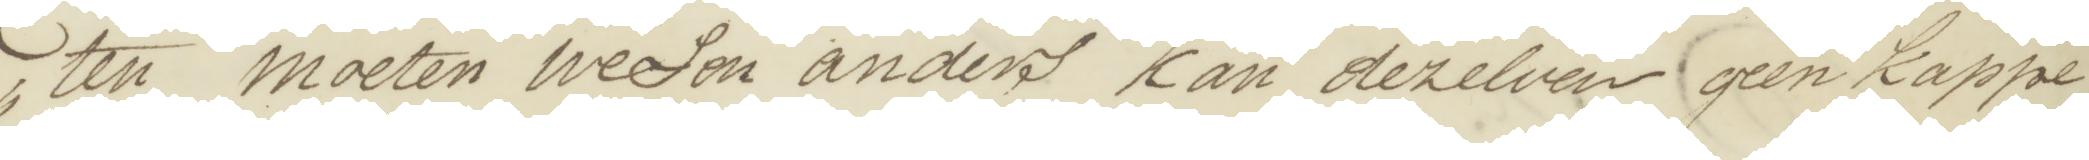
„ ten moeten wesen anders kan dezelven geen kappe
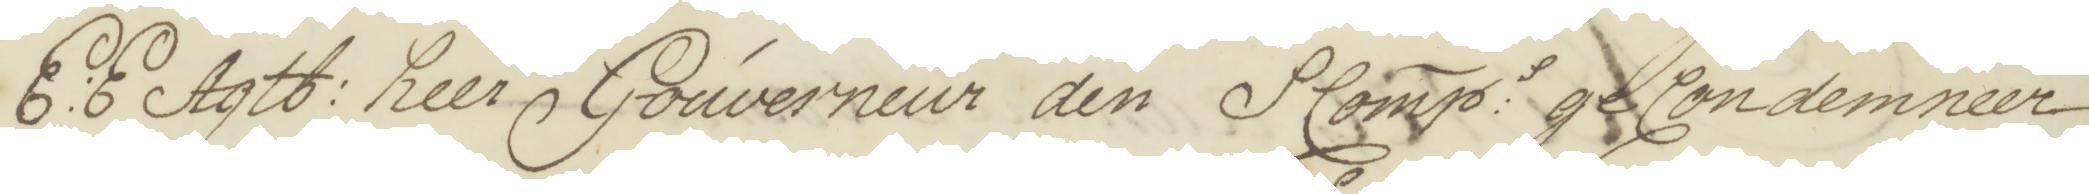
E: E Agtb: heer Gouverneur den s Comp:s gecondemneer
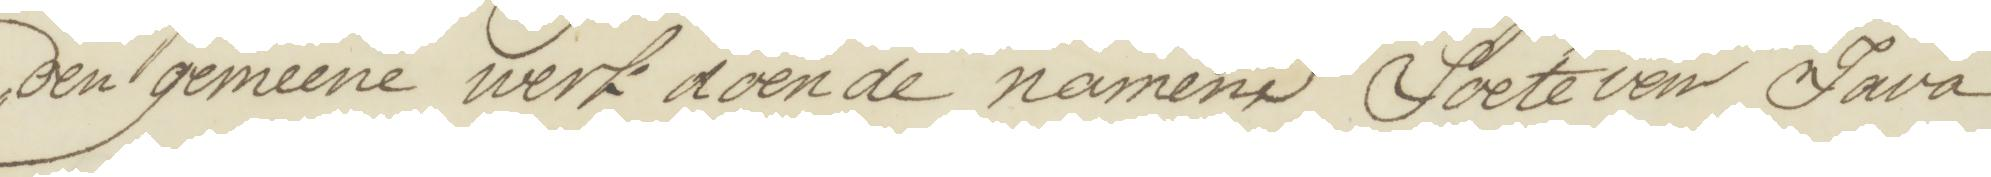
den gemeene werk doen de namens soete ven Iava
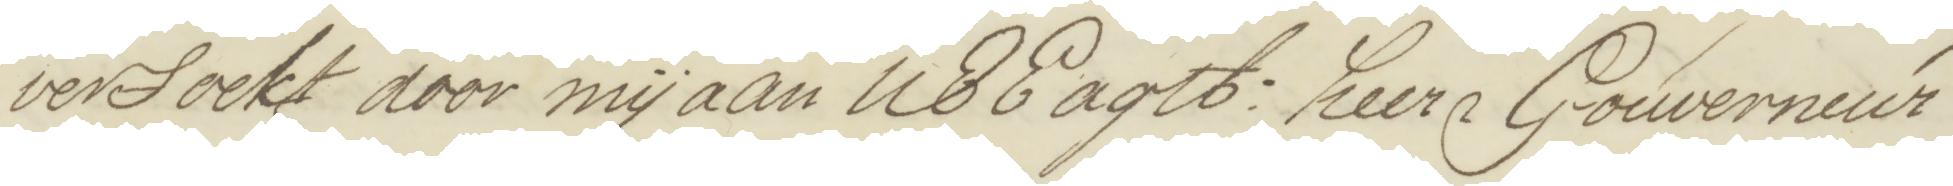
versoekt door mij aan UE E agtb: heer Gouverneur
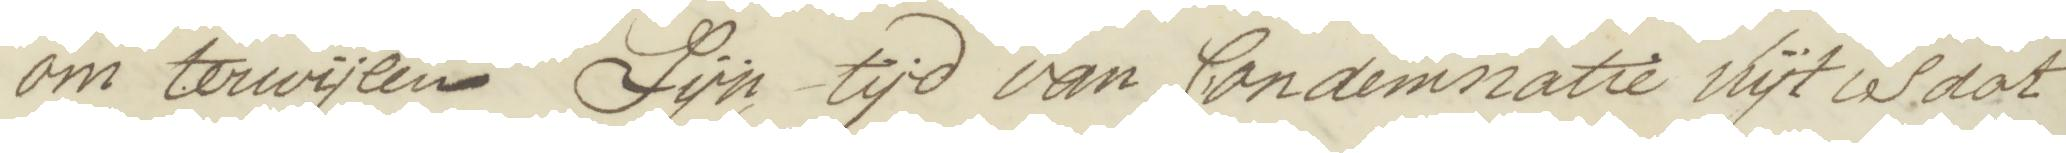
om terwijlen sijn tijd van condemnatie uijt is dat
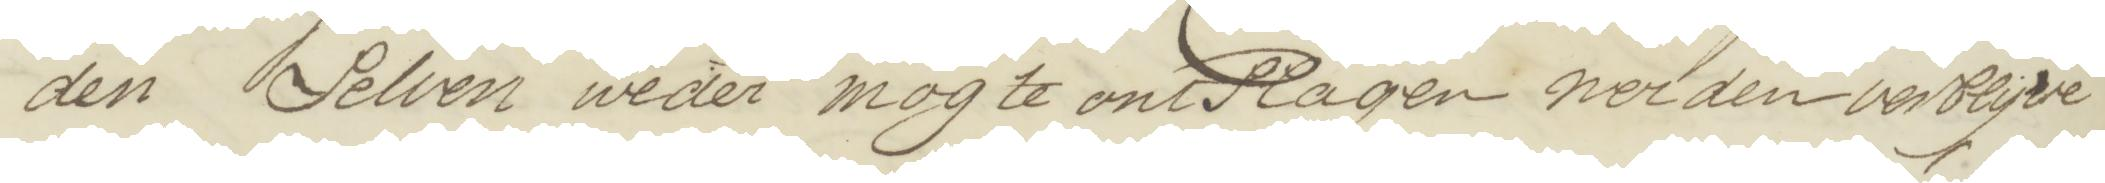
den selven weder mogte ontslagen werden verblijve
